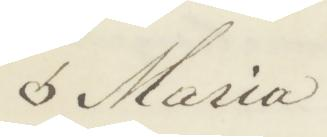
¶ Maria
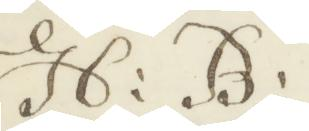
H: B.
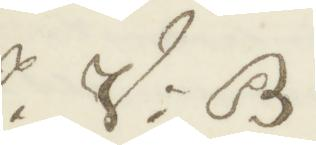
J: V: B
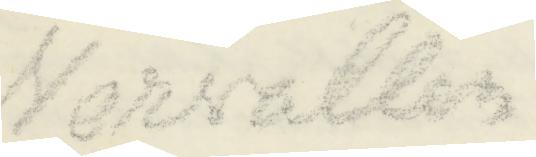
Vervallen
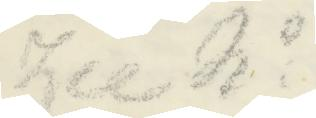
zie N.o
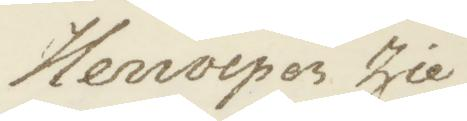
Herroepen zie
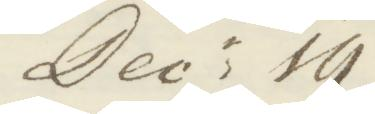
Dec:r 19
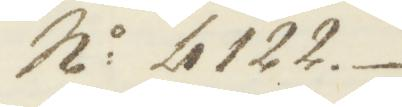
N:o 4122.—
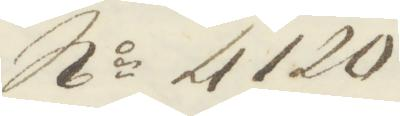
N=o 4120
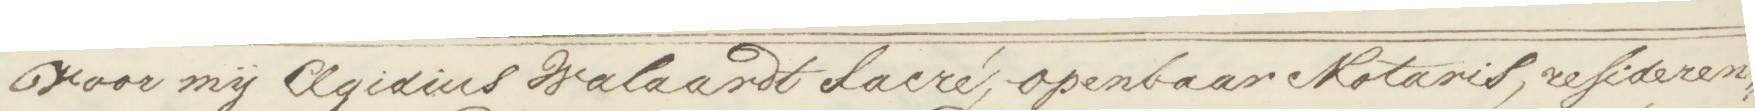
Voor mij AEgidius Walaardt Sacré, openbaar Notaris, resideren
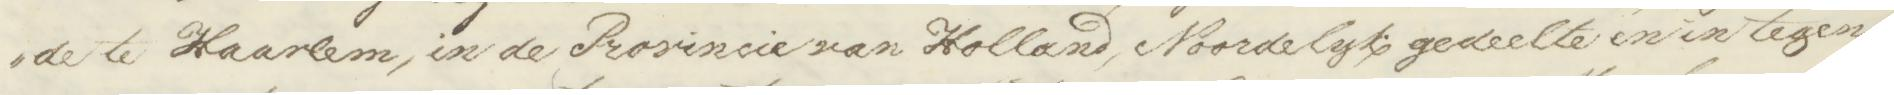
„de te Haarlem, in de Provincie van Holland, Noordelyk gedeelte en in tegen
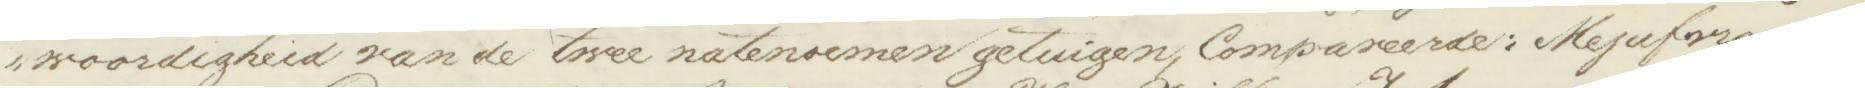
„woordigheid van de twee natenoemen getuigen, Compareerde: Mejufvrouw
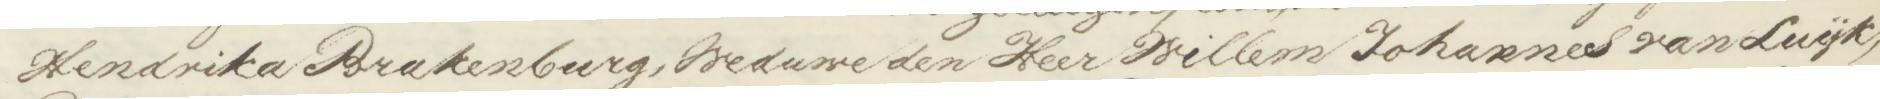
Hendrika Brakenburg, Weduwe den Heer Willem Iohannes van Luijk,
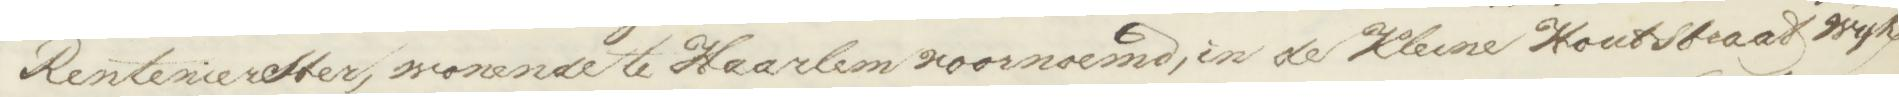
Rentenierster, wonende te Haarlem voornoemd, in de Kleine Houtstraat wyk
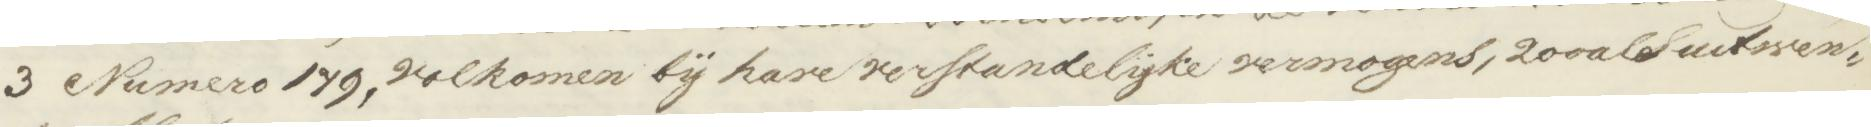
3 Numero 179, volkomen bij hare verstandelijke vermogens, zoo als uitwen„
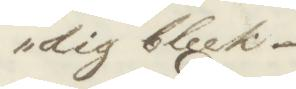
„dig bleek.
